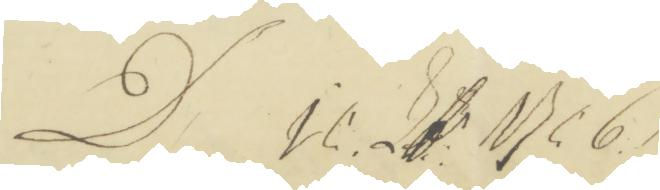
D 15. Jbr: 1756.
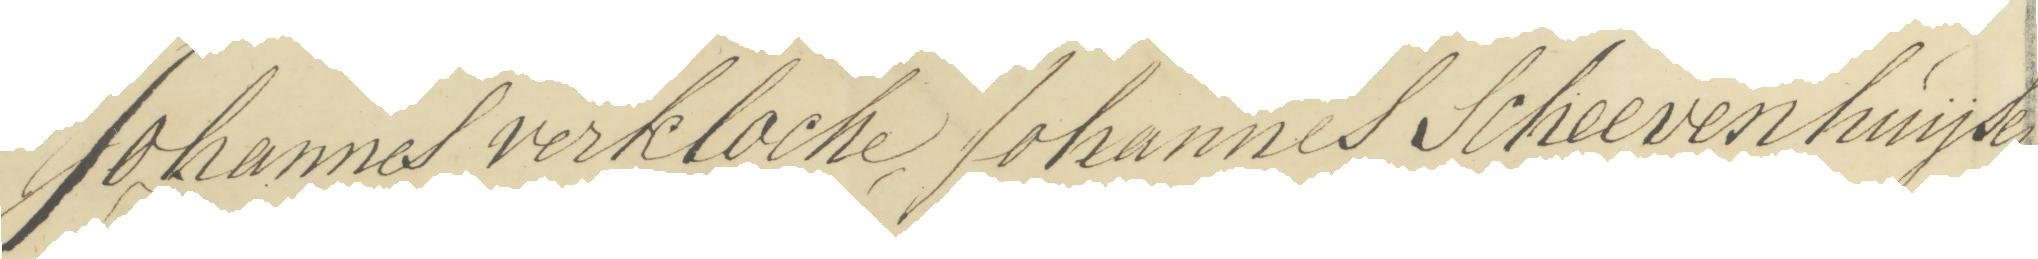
Johannes verkloche Johannes scheeven huijsen
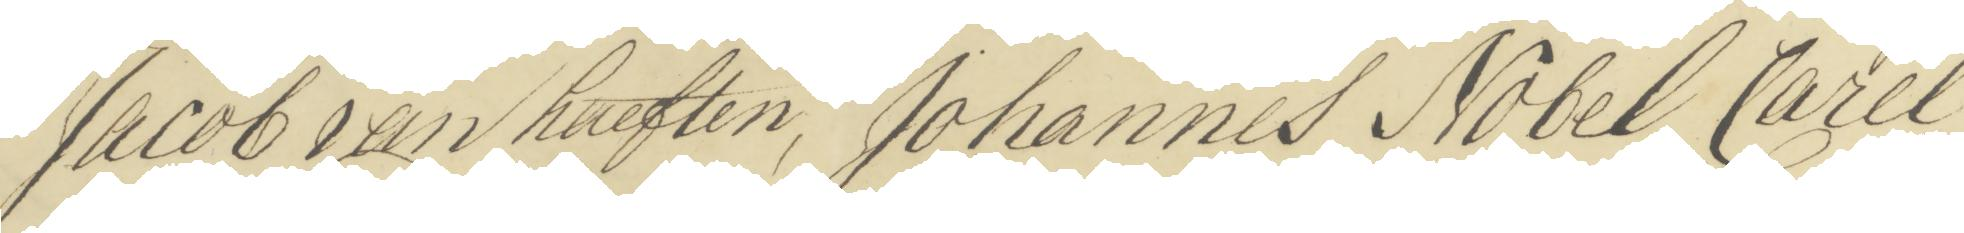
Jacob van haeften, Johannes Nobel Carel
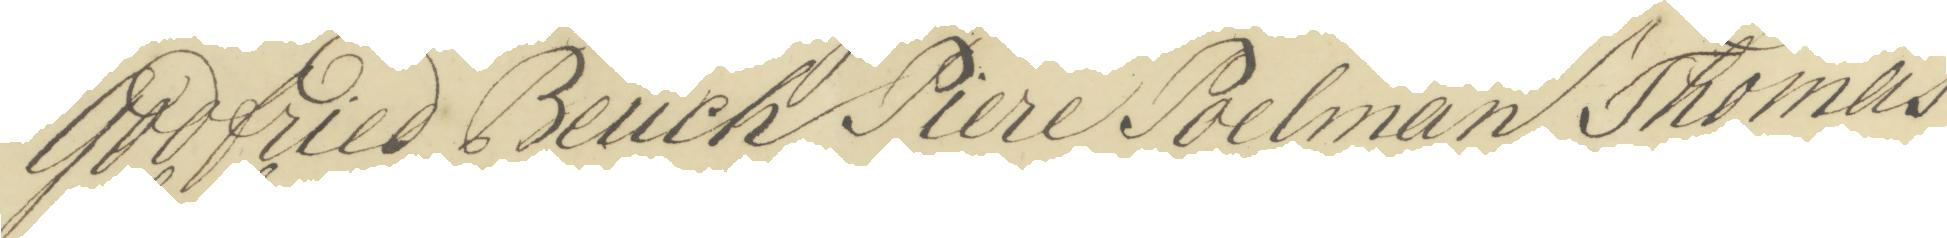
Godfried Beuch Piere Poelman Thomas
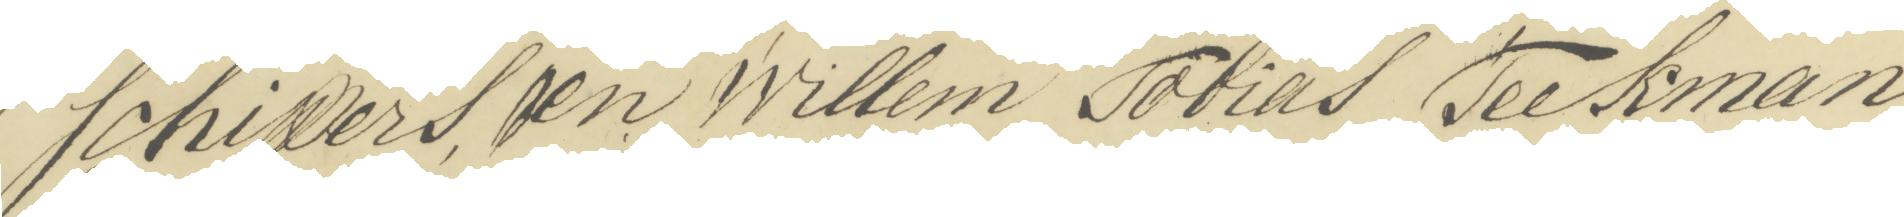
schippers, en Willem Tobias Teekman
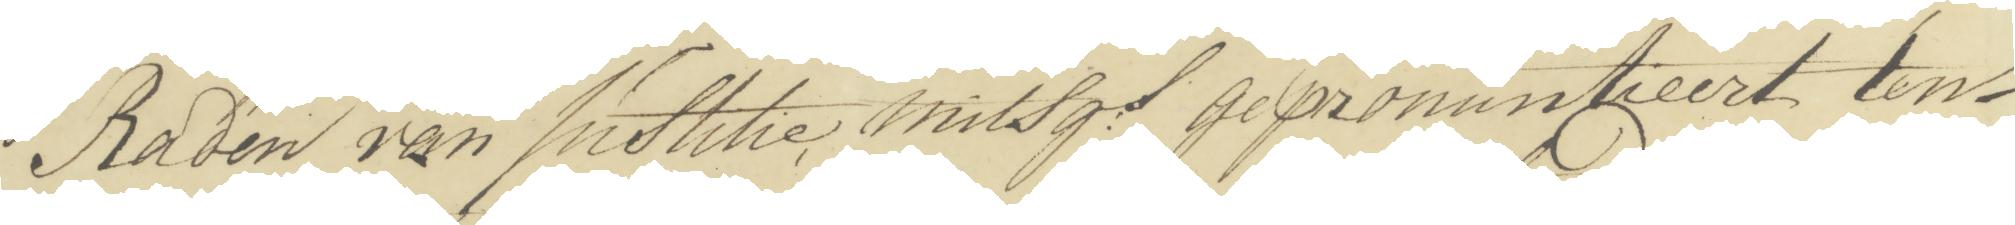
Raden van Justitie, mitsg:s gepronuntieert ten
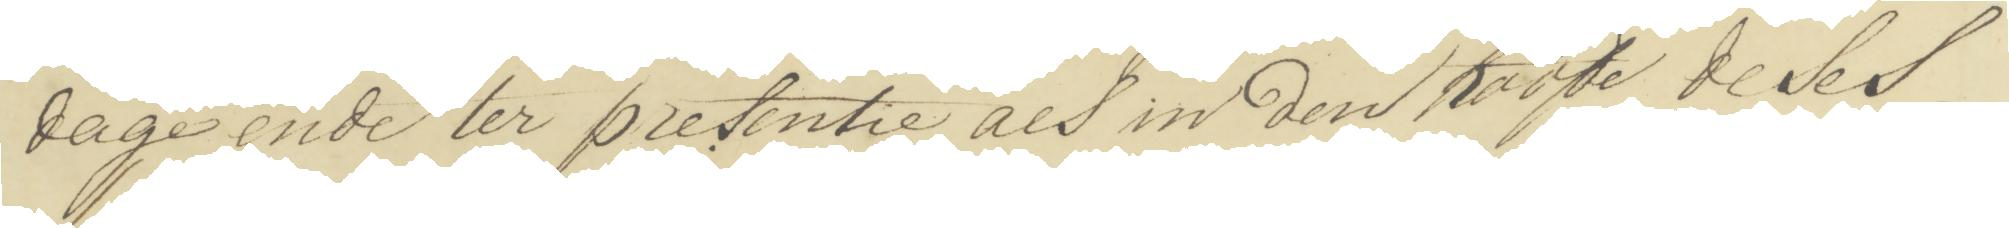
dage ende ter presentie als in den hoofde deses
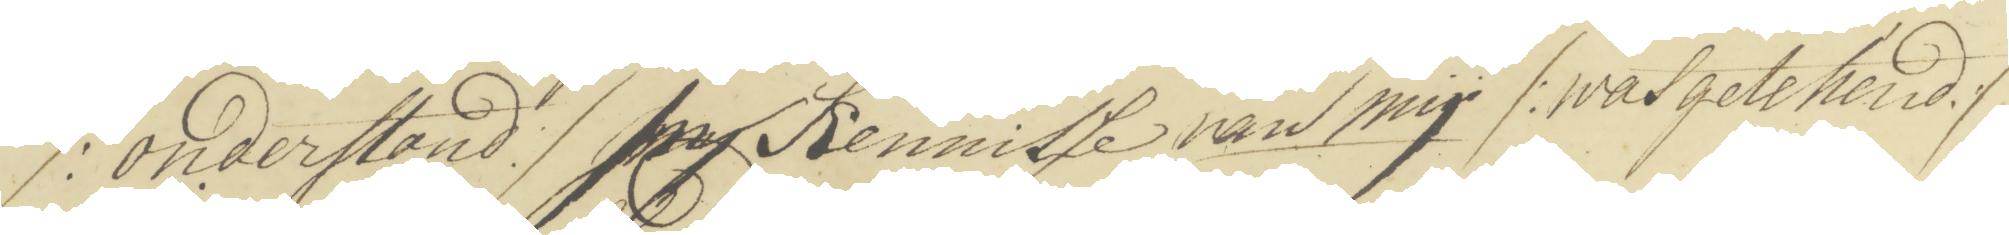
/:onderstond:/ Jn kennisse van mij /:was getekend:/
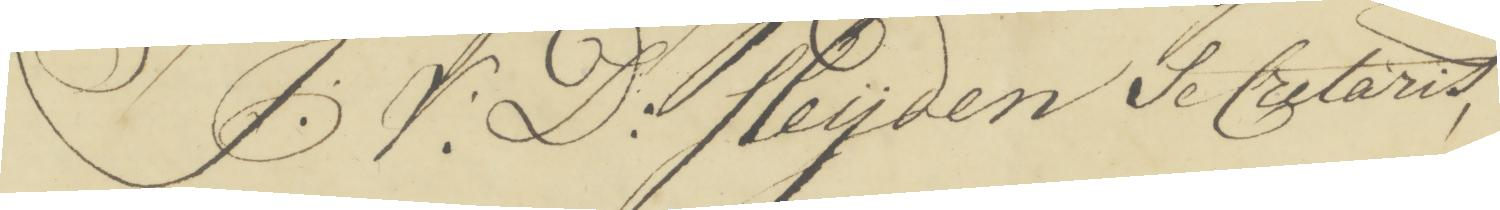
J: V: D: sleijden seCretaris,
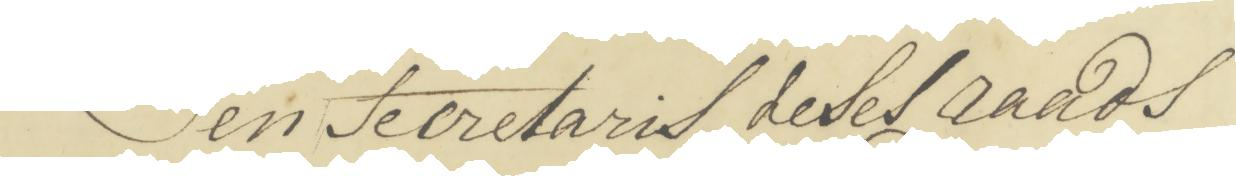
Den secretaris deses raads
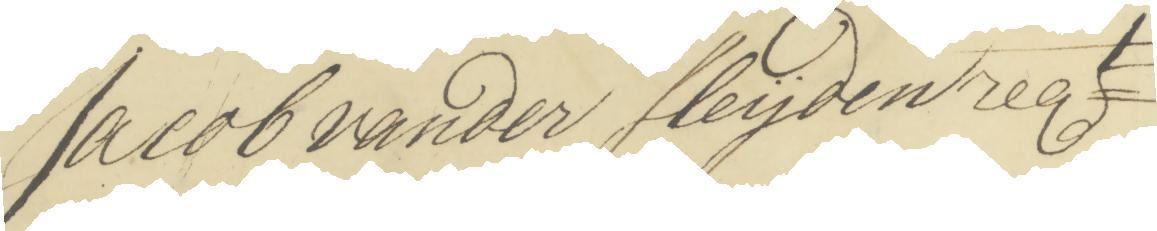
Jacob vander sleijden reg=t
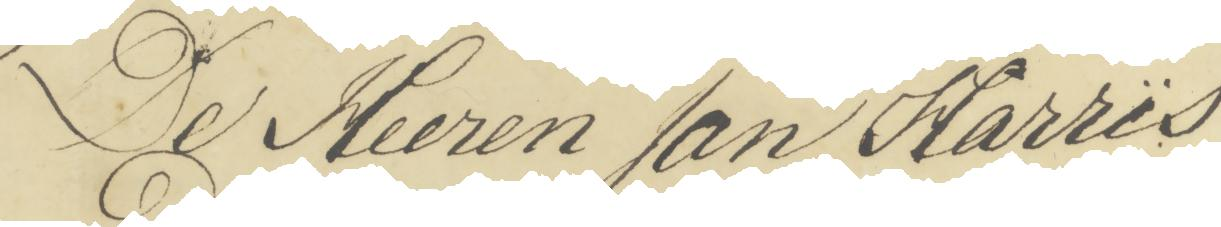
De Heeren Jan Harris
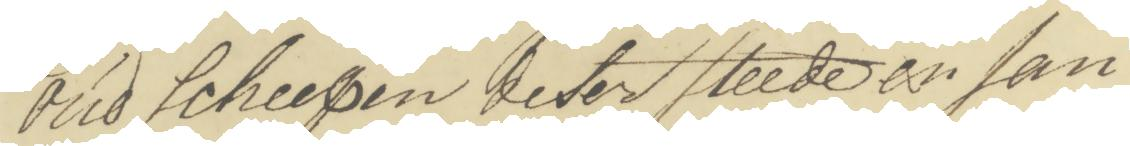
oud scheepen deser steede en Jan
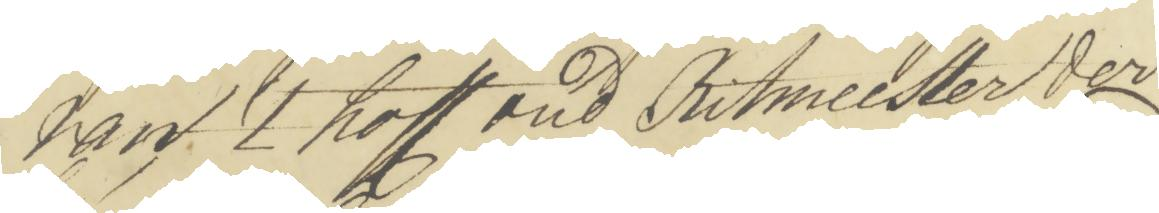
van ’t hoff oud Ritmeester der
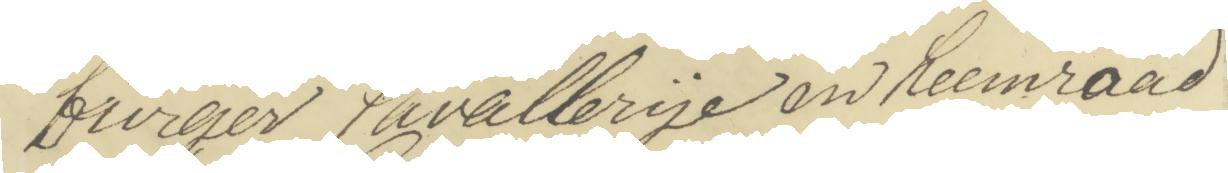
burger Cavallerije en heemraad
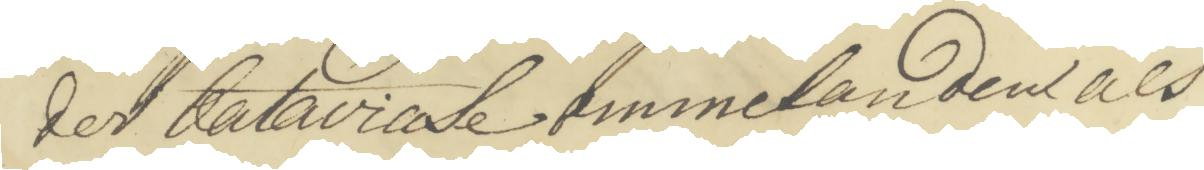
der bataviase ommelanden als
